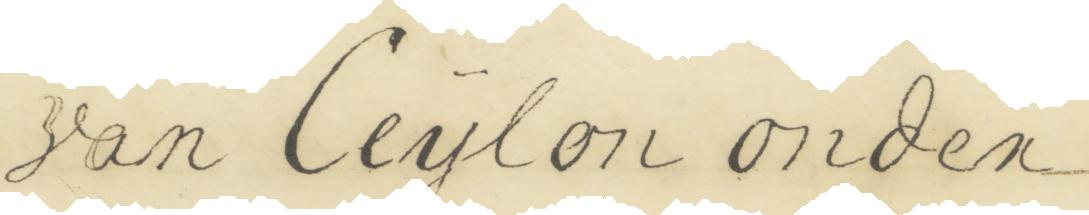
van Ceijlon onder
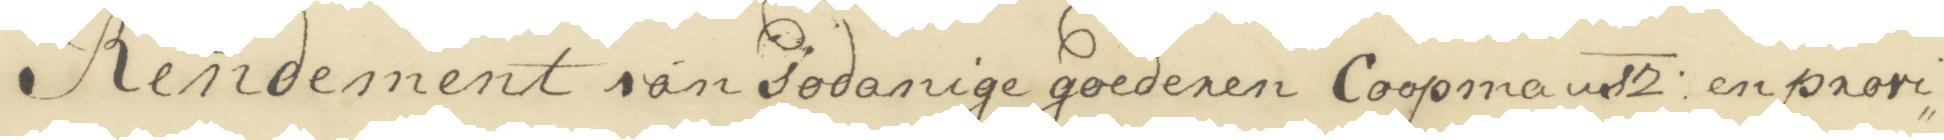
Rendement van sodanige goederen Coopmansz: en provi„
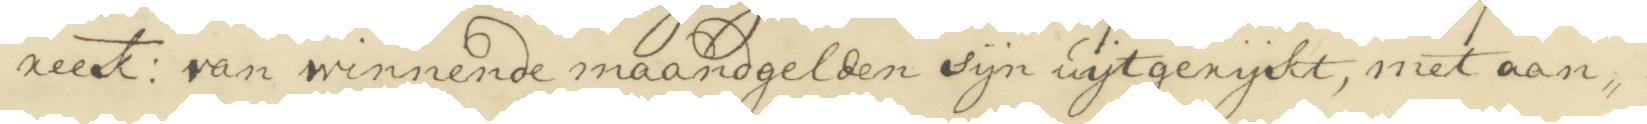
reest: van winnende maandgelden sijn uijtgerijkt, met aan„
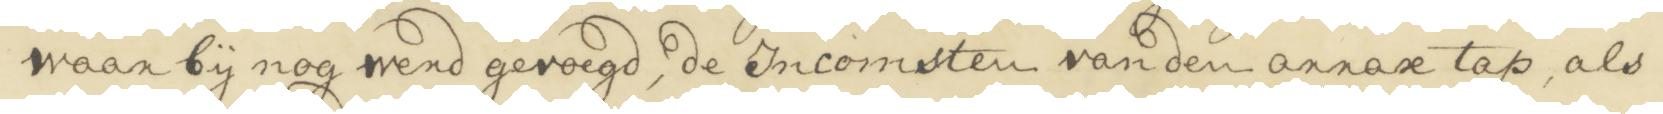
waar bij nog werd gevoegd, de Incomsten van den arrax tap, als
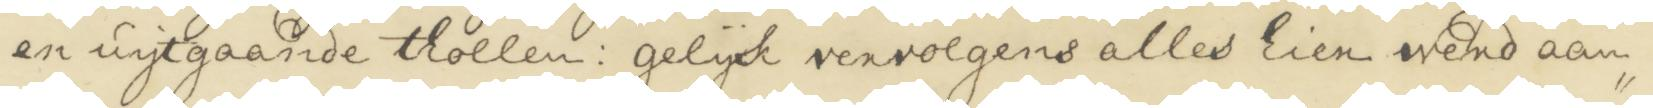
en uijtgaande thollen: gelijk vervolgens alles hier werd aan„
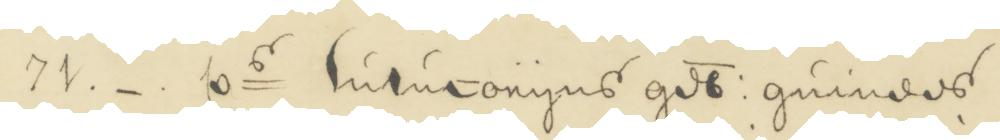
71.—. p=s tutucorijns geb: guinees
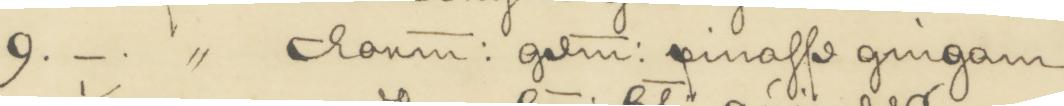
9. — „ chorm: gem: pinasse gingam
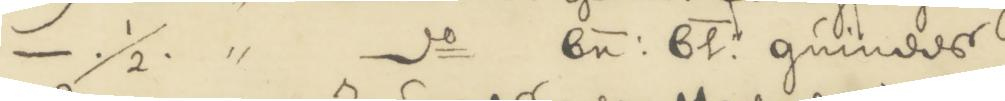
—.½. „ _=o br: bl: guinees
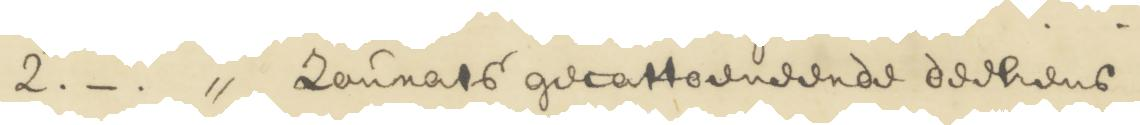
2. –. „ zourats gecattoeneerde deekens
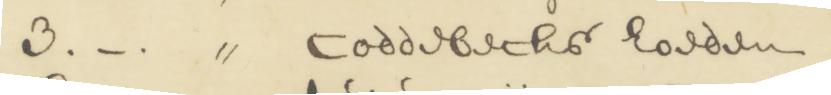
3. —. „ coddebecks hoeden
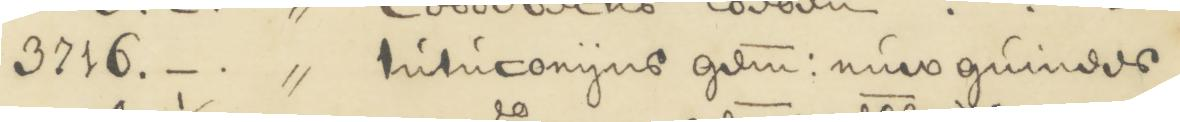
3716.— „ tutucorijns gem: ruw guinees
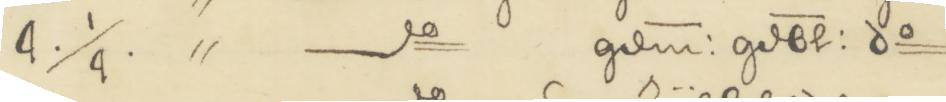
4.¼. „ _=o gem: gebl: d=o
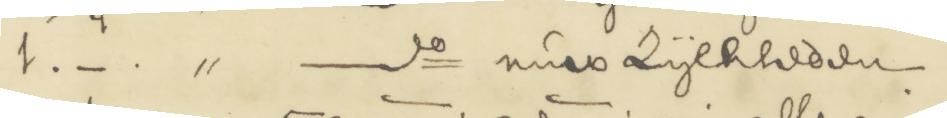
1.—. „ _=o ruw zijlkleden
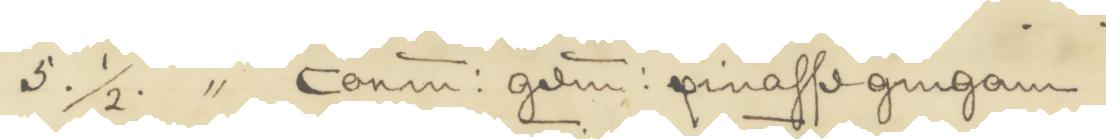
5.½. „ Corm: gem: pinasse gingam
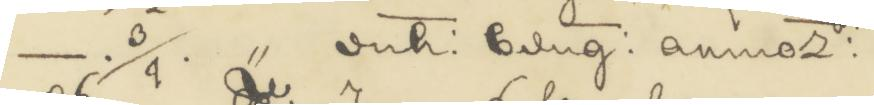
—.¾. „ enk: beng: armoz:
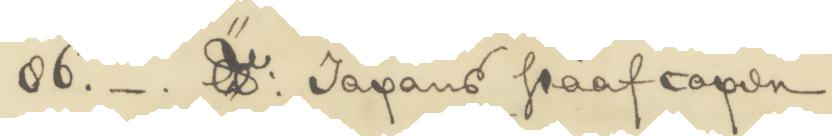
86.—. lb: Iapans staaf coper
